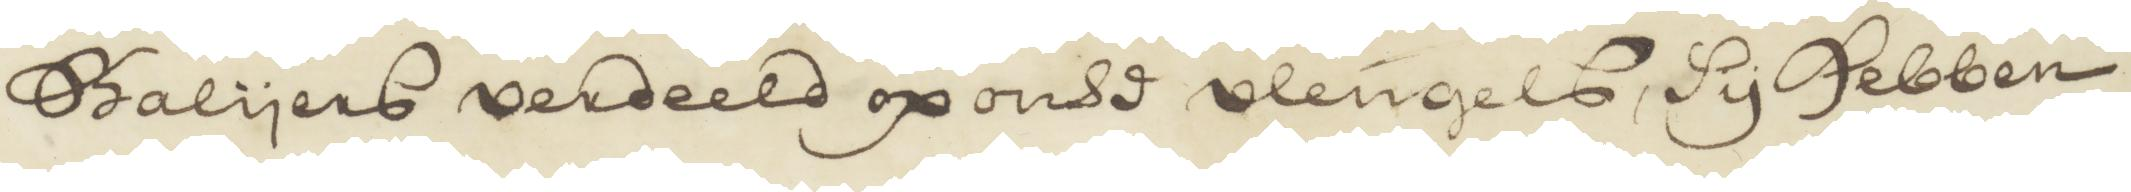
Balijers verdeeld op onse vleugels, Sij Hebben
